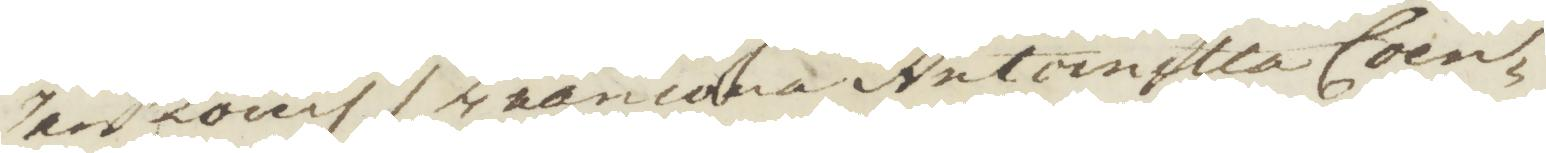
Jan Louis / Francina Antoinetta Coen„
